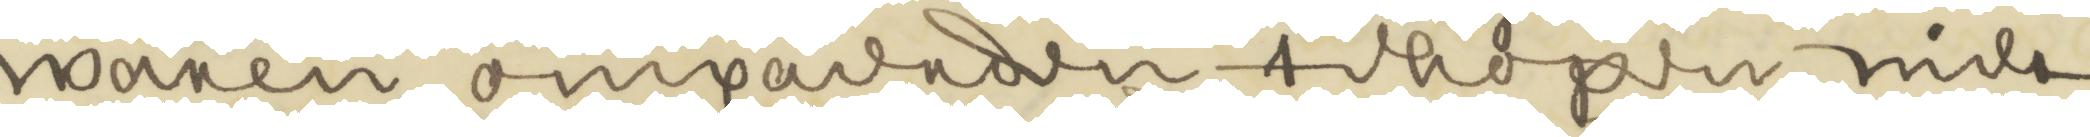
waren om paerden te hopen, niet
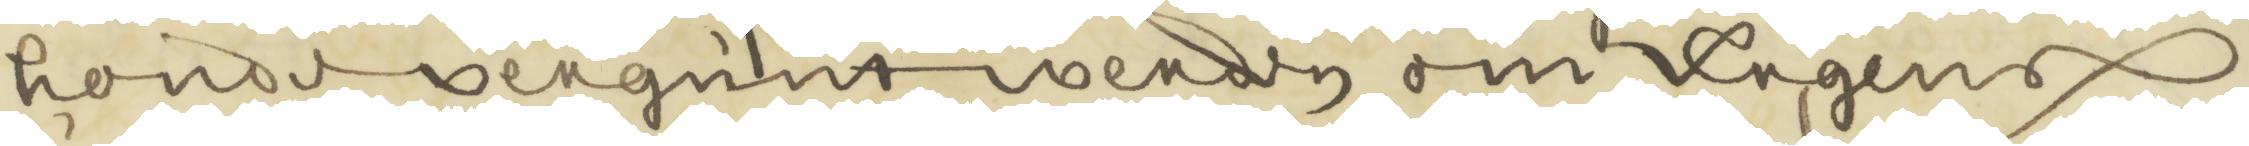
konde vergunt werden om Ergens
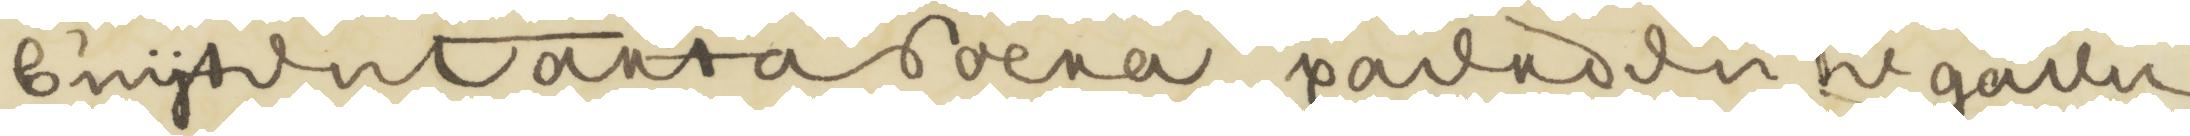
buijten Cartasoera paerden te gaen
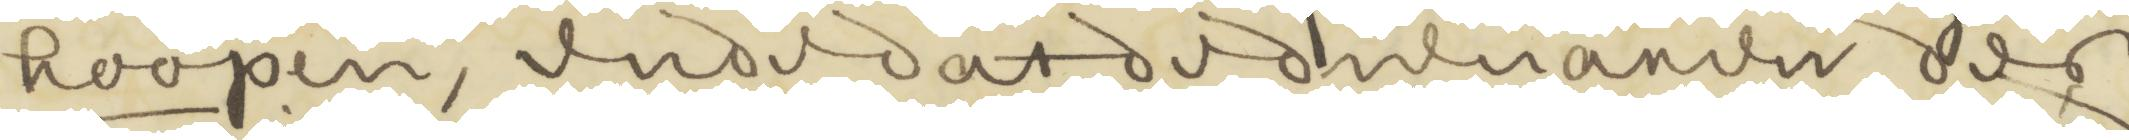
koopen, ende dat de dienaren des
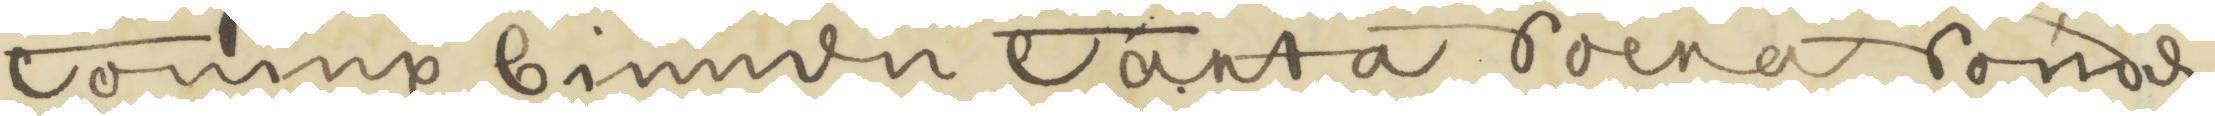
Coninx binnen Carta Soera souden
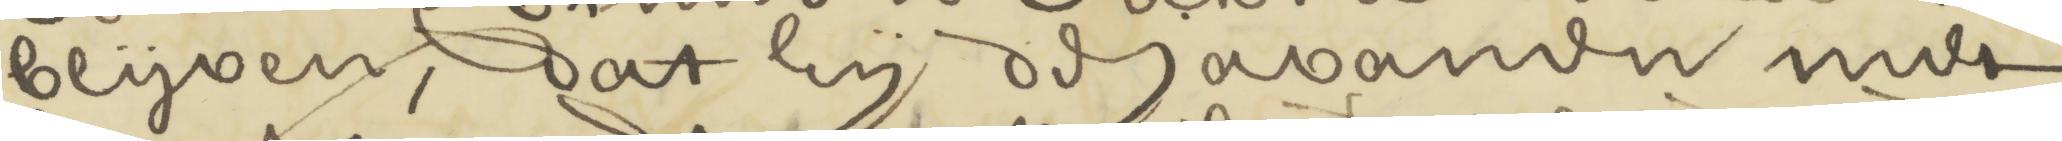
blijven, dat hij de javanen met
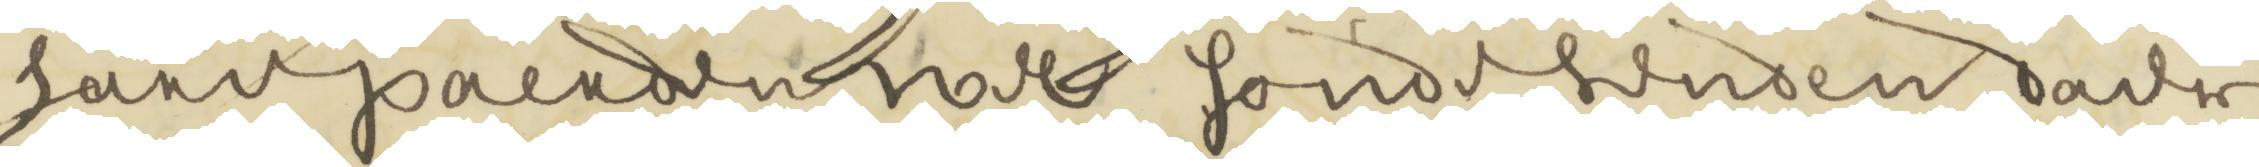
hare paerden wel soude senden daer
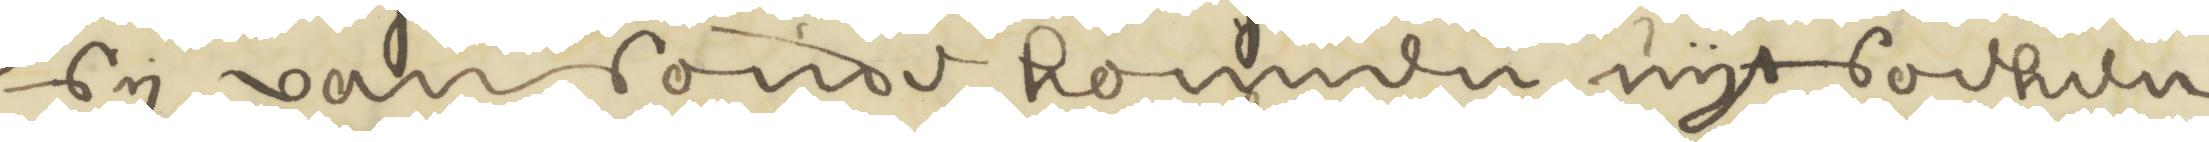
sij van soude konnen uijt soeken
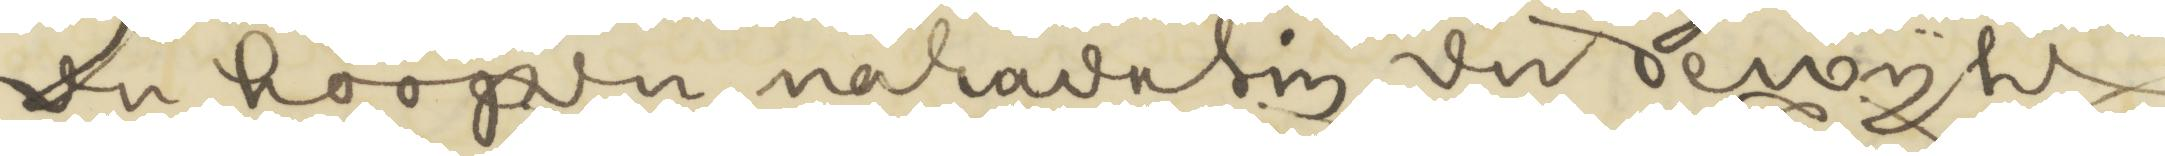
en koopen na haer sin, en dewijle
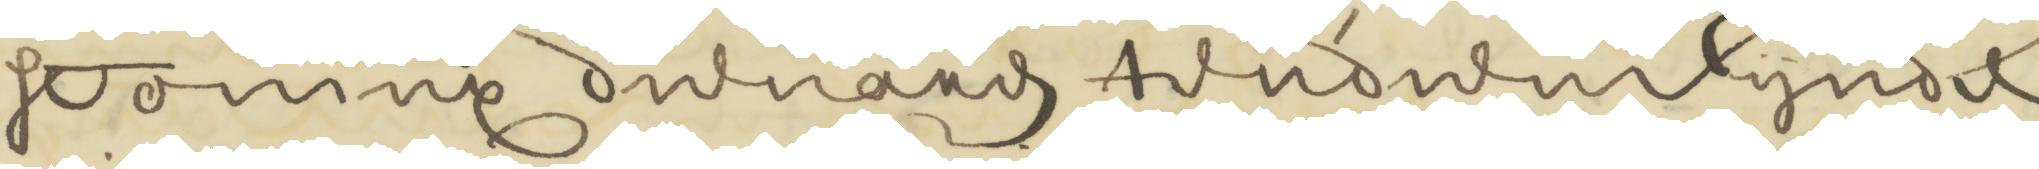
sConinx dienaren ten dien Eijnde
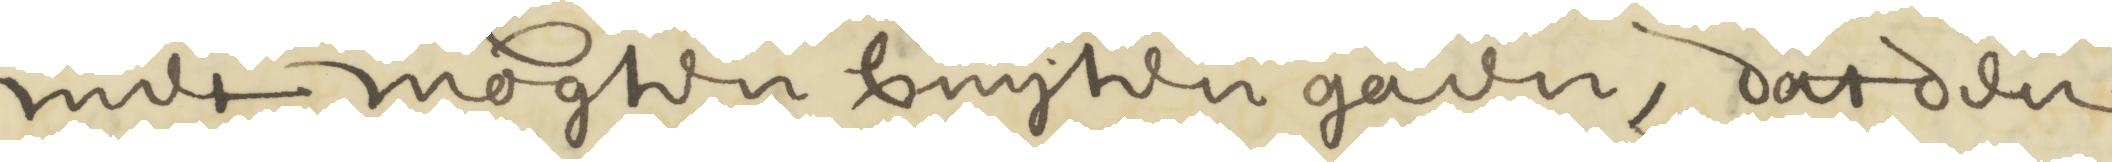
niet mogten buijten gaen, dat den
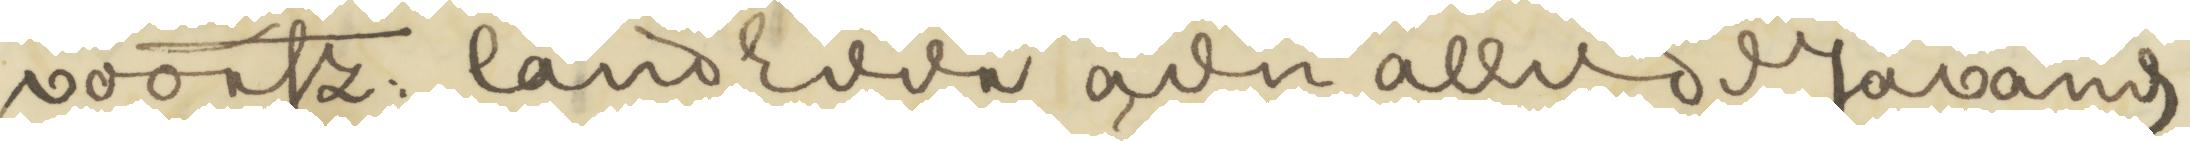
voorsz: land heer aen alle de Javanen
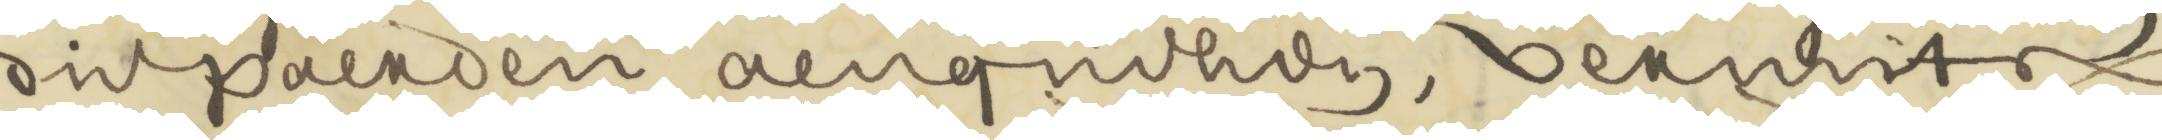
die paerden aenqueken, vermits
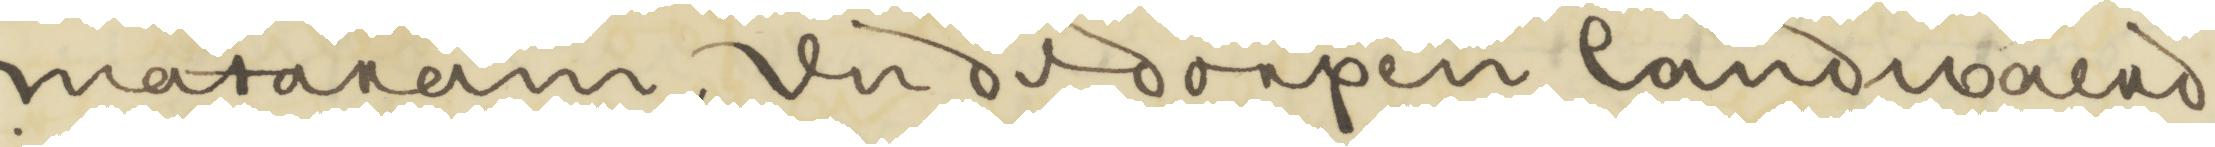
mataram, en de dorpen landwaerd
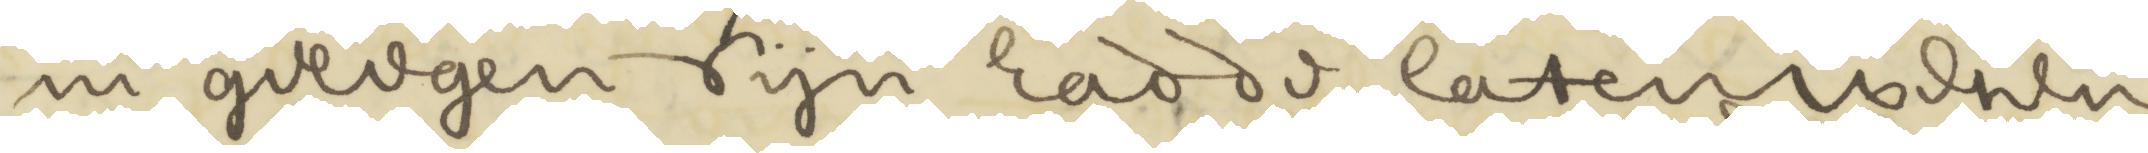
in gelegen sijn hadde laten weten
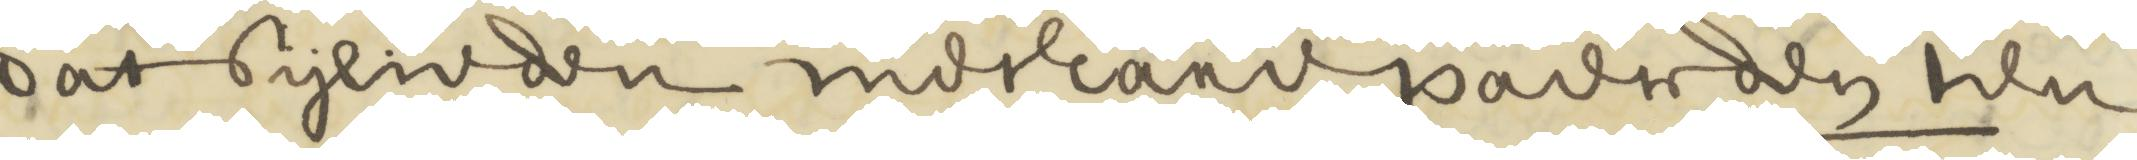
dat sijlieden methare paerden ten
